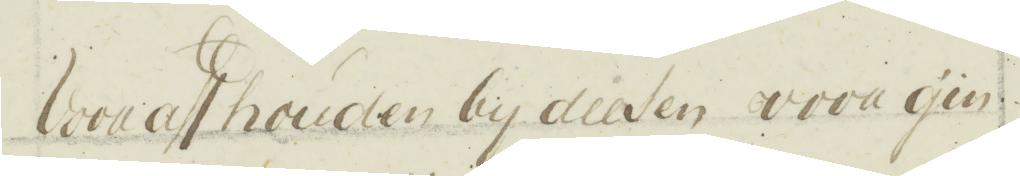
Voor afhouden by deesen voor g'in
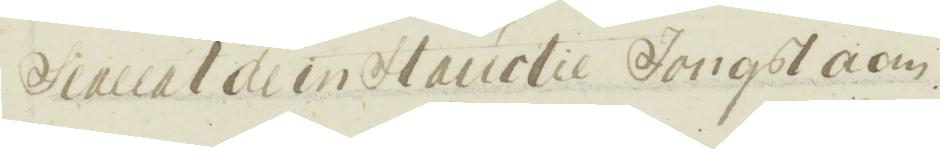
Sereert de instructie Jongst aan
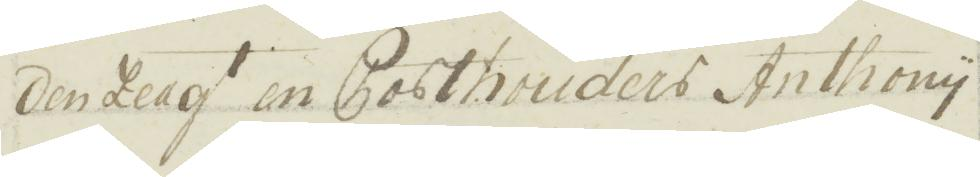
den zergt en Posthouders Anthonij
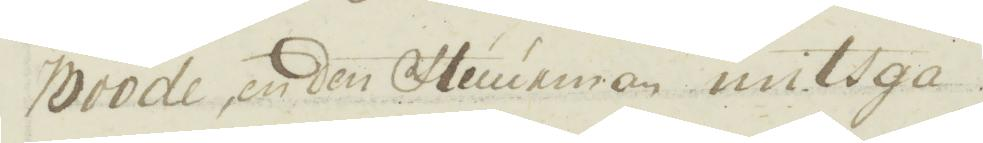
Boode, en den stuurman mitsga
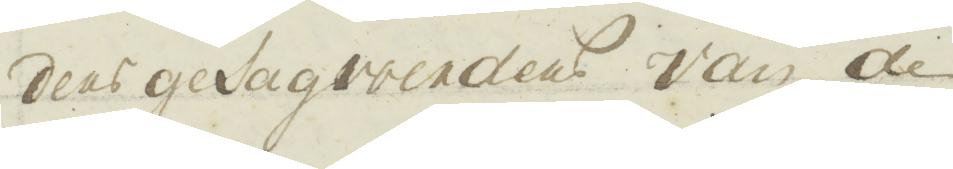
ders gesagvoerders van de
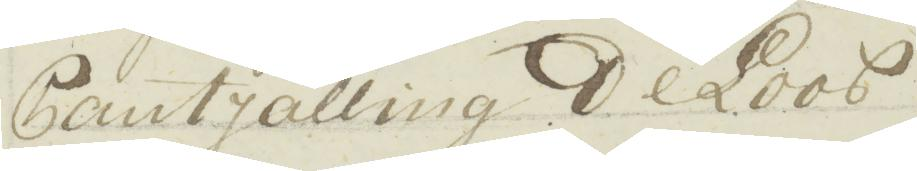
Pantjalling de Loos
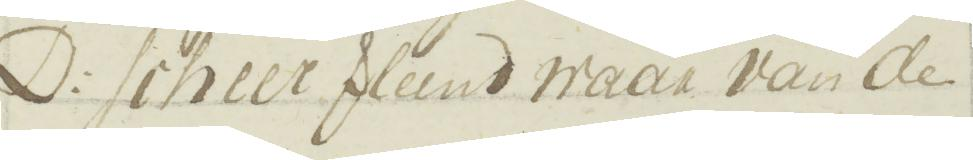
D: scheer verland waar van de
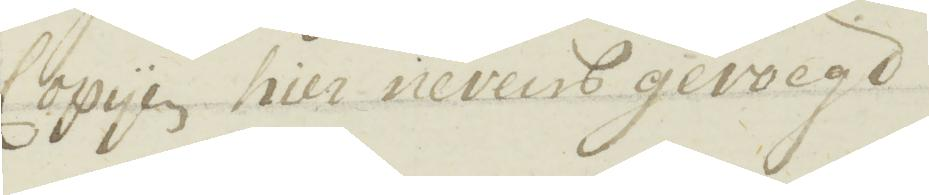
Copijen hier nevens gevoegd
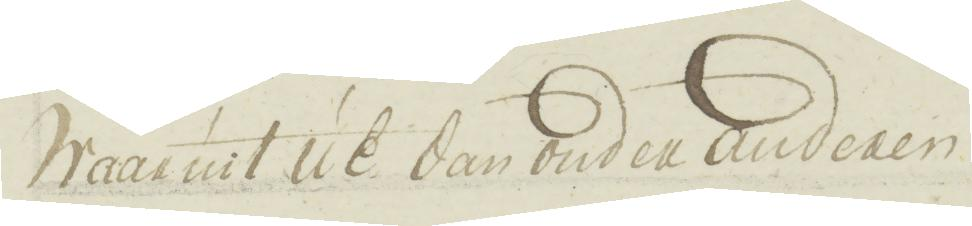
Waar uit UE: dan onder anderen
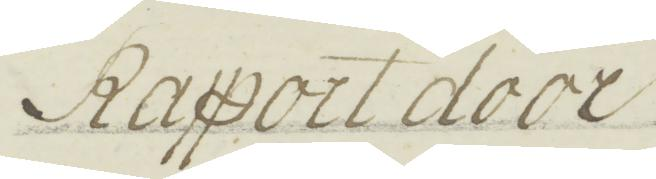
Rapport door
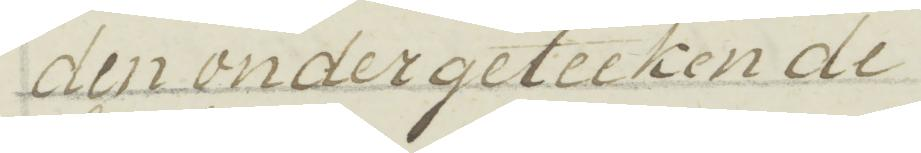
den ondergeteekende
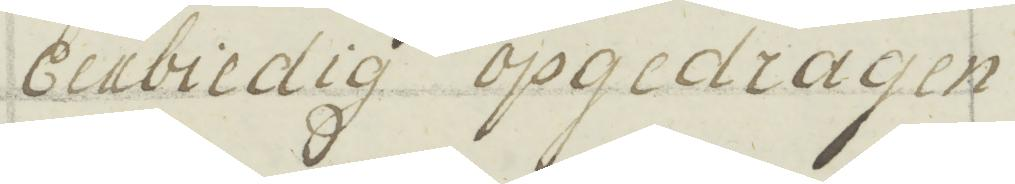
Eerbiedig opgedragen
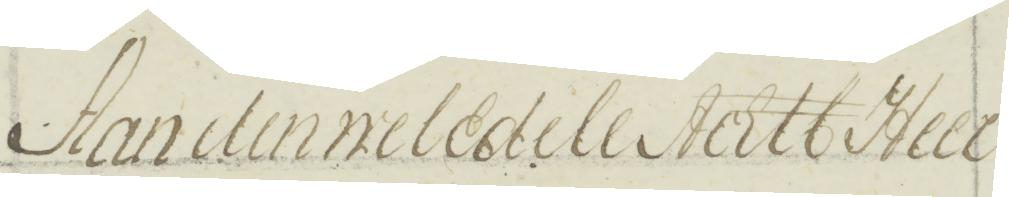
Aan den wel Edele Achtb Heer
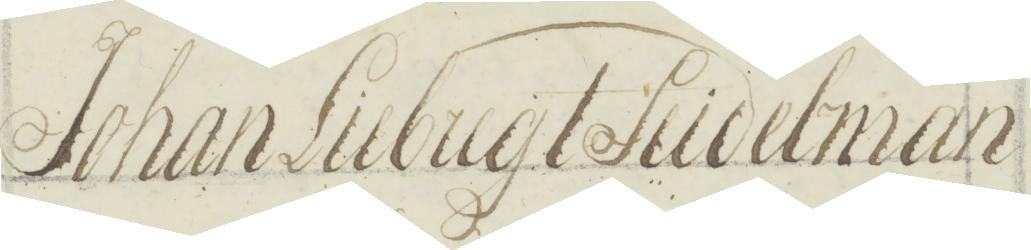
Johan Liebregt Seidelman
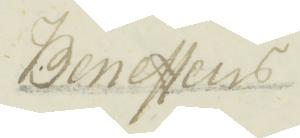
Beneffens
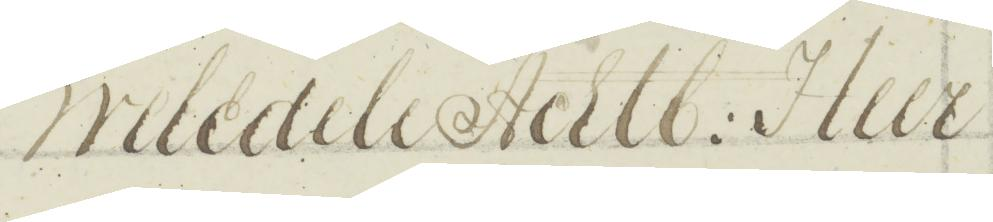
WelEdele Achtb: Heer
